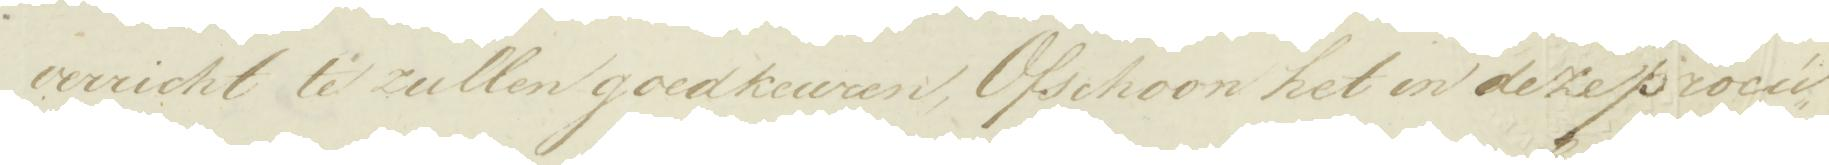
verricht te zullen goedkeuren, Ofschoon het in deze procu„
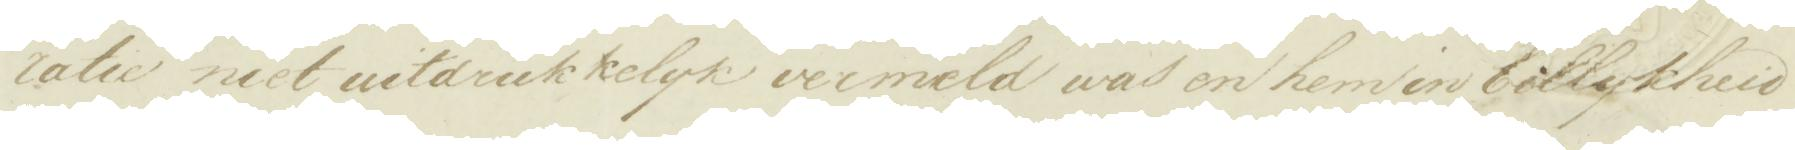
ratie niet uitdrukkelyk vermeld was en hem in billykheid
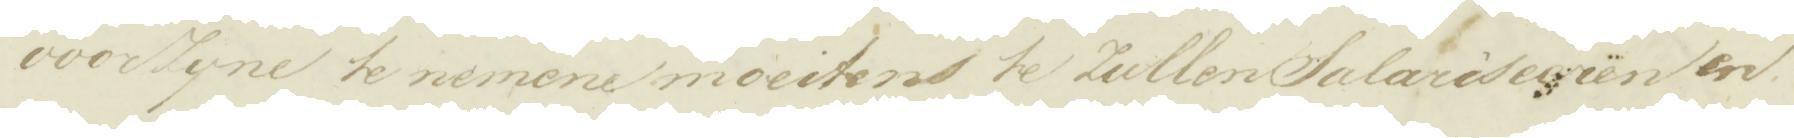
voor zyne te nemene moeitens te zullen Salariseerën en
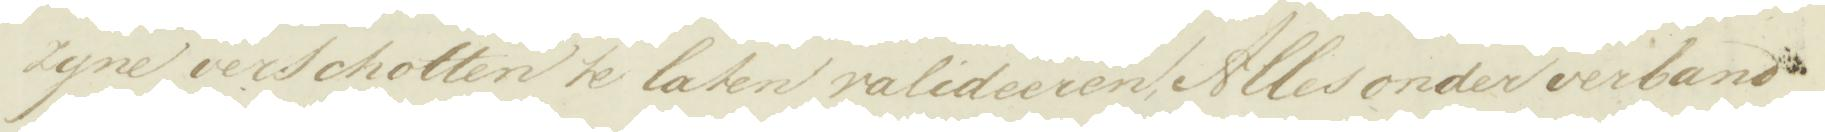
zyne verschotten te laten valideeren, Alles onder verband
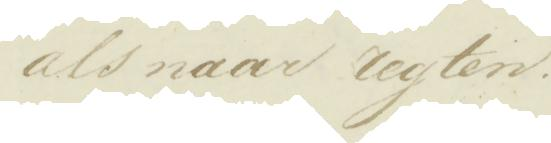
als naar regten.
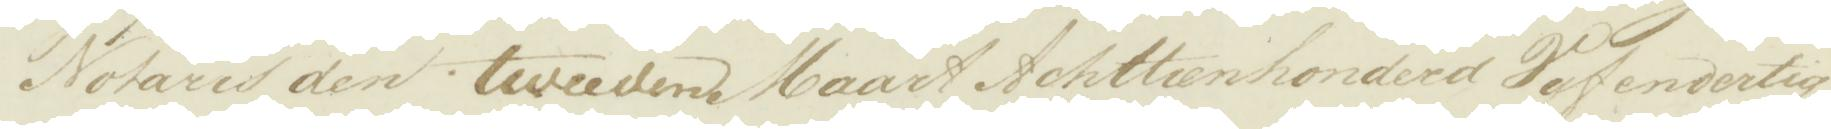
Notaris den tweeden Maart Achttienhonderd Vyfendertig,
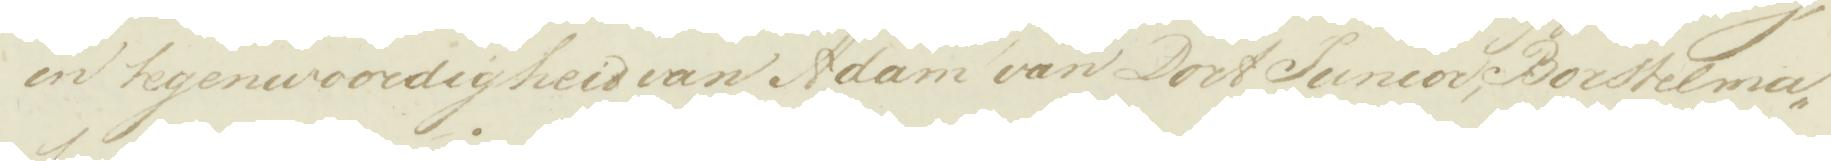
in tegenwoordigheid van Adam van Dort Iunior, Borstelma„
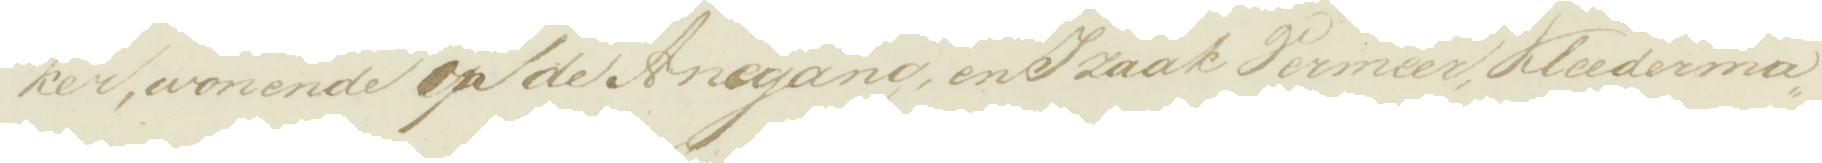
ker, wonende op de Anegang, en Izaak Vermeer, Kleederma„
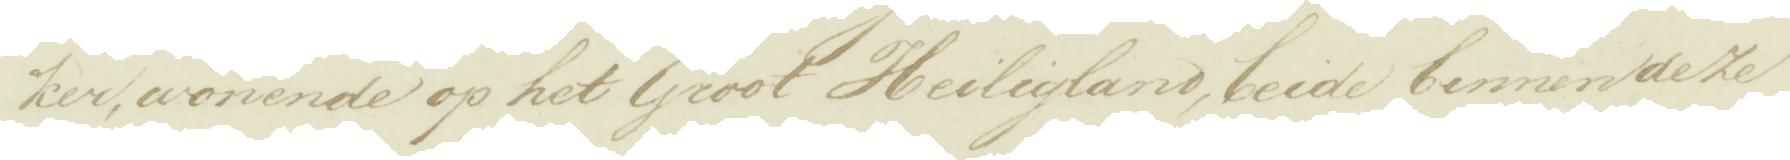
ker, wonende op het Groot Heiligland, beide binnen deze
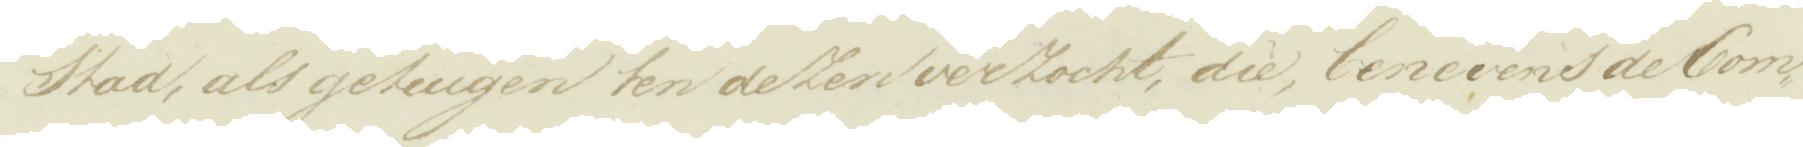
stad, als getuigen ten dezen verzocht, die, benevens de Com„
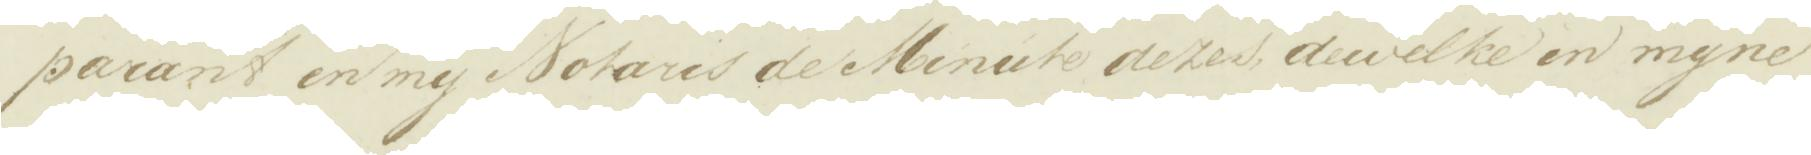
parant en my Notaris de Minute dezes, dewelke in myne
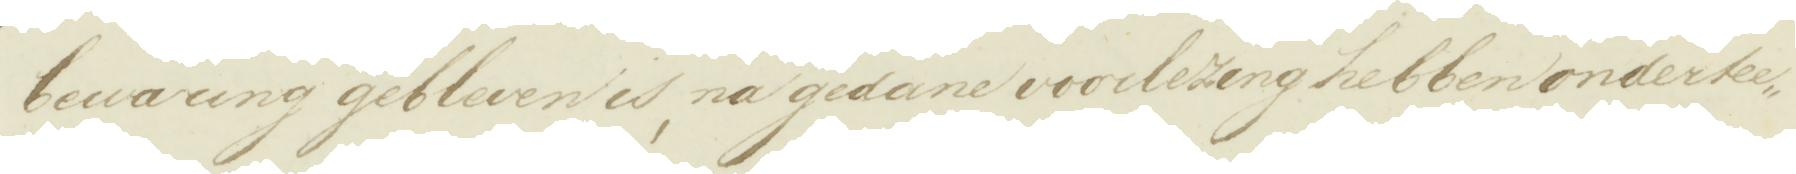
bewaring gebleven is, na gedane voorlezing hebben ondertee„
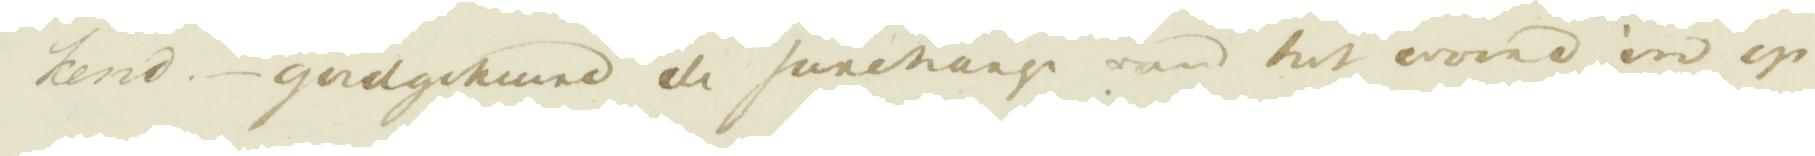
kend. — goedgekeurd de surcharge van het woord in op
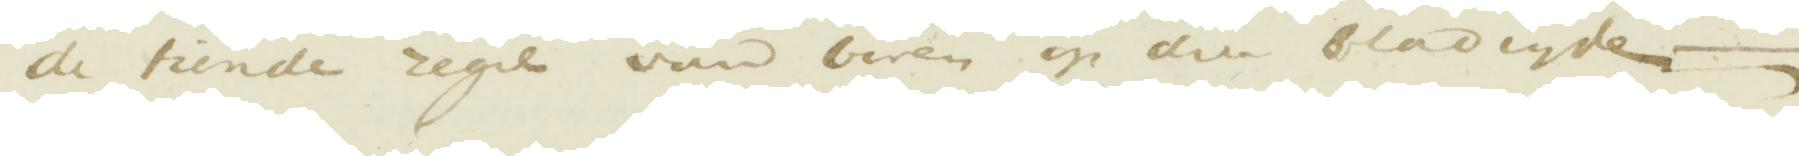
de tiende regel van boven op den bladzyde—,
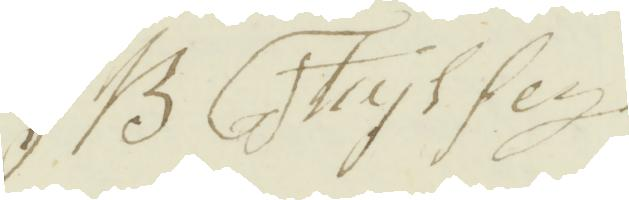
JB Thijssen
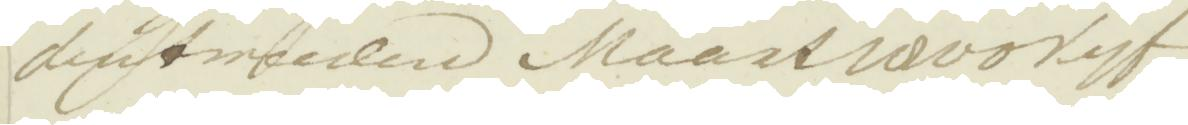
den tweeden Maart 1800 vyf
